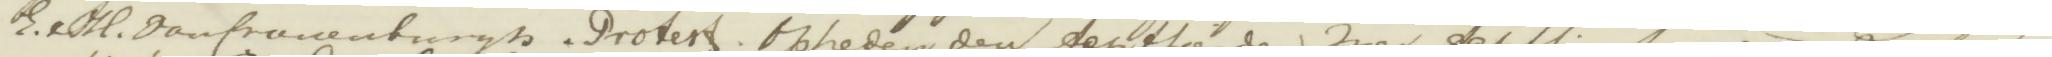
E. & H. Van Cranenburgh , Protest. Opheden den Achttienden Mei Achttienhonderd Negen en
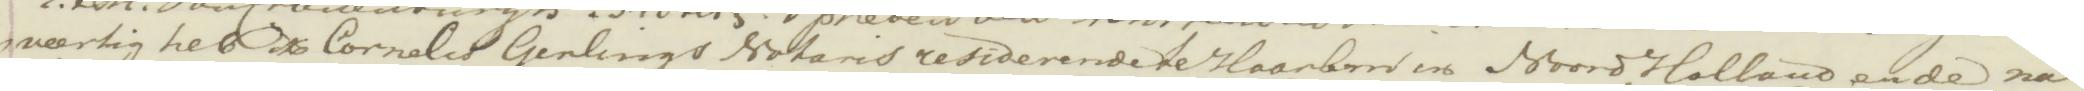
veertig heb ik Cornelis Gerlings Notaris residerende te Haarlem in Noord Holland ende na
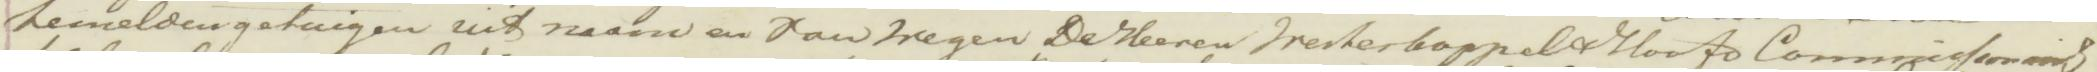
temelden getuigen uit naam en Van Wegen De Heeren Westerkoppel & Hoofd Commissionairs
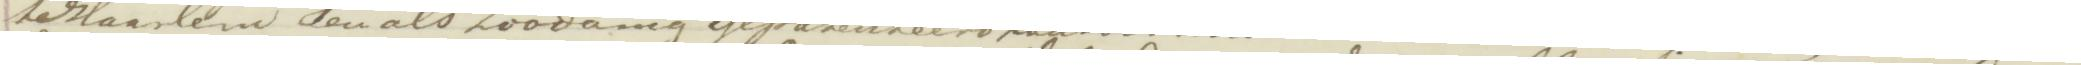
te Haarlem en als Zoodanig gepatenteerd kantoorhoudende aan de Oude gracht als houders
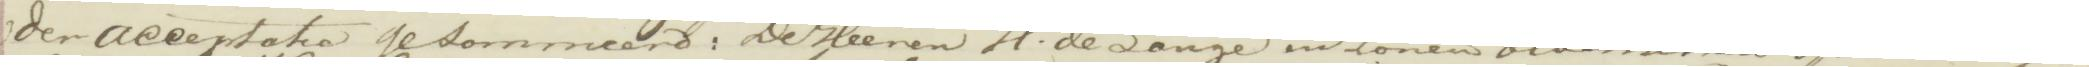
„der acceptatie gesommeerd: De Heeren H. de Lange en Zonen bloemisten op den Cingel
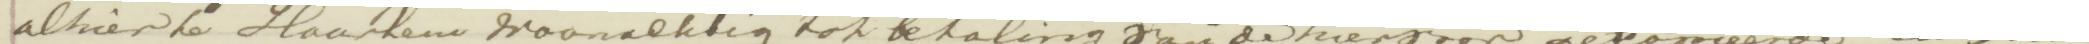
alhier te Haarlem woonachtig tot betaling van de hiervoor gecopieerde en Voor
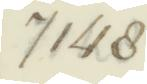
7148
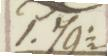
1.79½
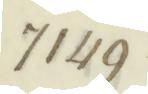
7149
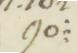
90½
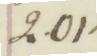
2.01
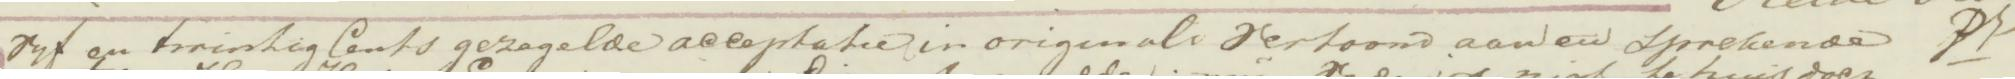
Vyf en twintig Cents gezegelde acceptatie in originale Vertoond aan en sprekende Ph
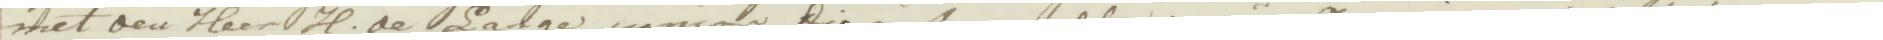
met den Heer H. de Lange junior die antwoordde: mijn Vader is niet te huis doch
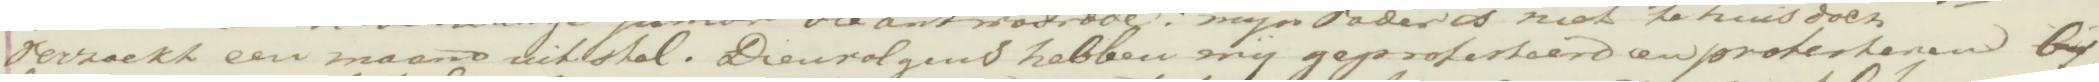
verzoekt een maand uitstel. Dienvolgens hebben mij geprosesteerd en protesteren bij
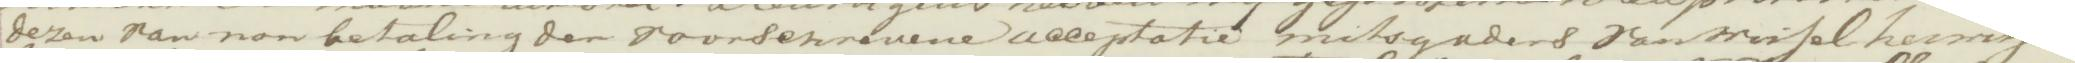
dezen van nan betaling der voorschrevene acceptatie mitsgaders van wissel herwissel
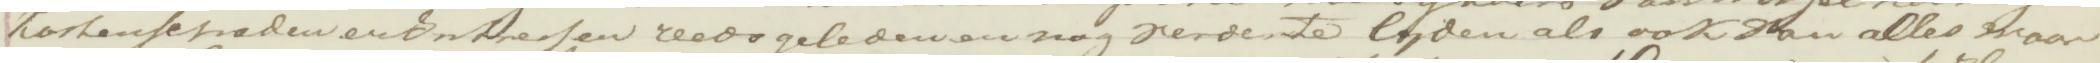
Kostenscheden en Intressen reedsgeleden en nog verdente lyden als ook van alles waar
